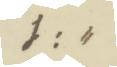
1: „
